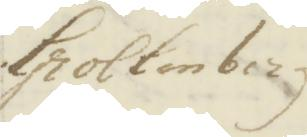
Groltenberg
